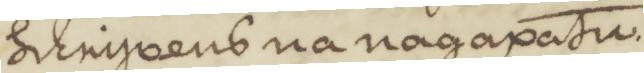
schrijvens na nagapatn.
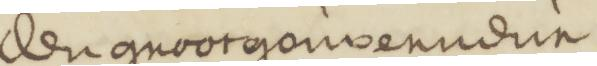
den groot gouverneur
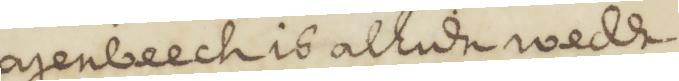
ajerbeeck is alhier weder
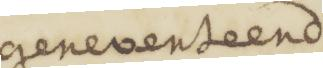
gereverteerd
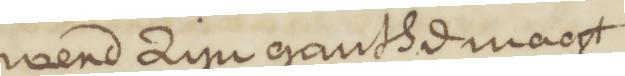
werd Zijn gantse magt
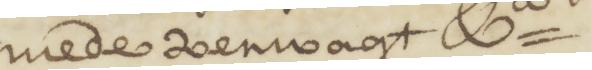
mede verwagt Et=a
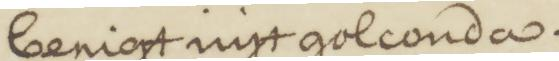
berigt uijt golconda
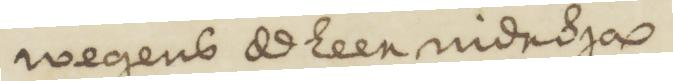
wegens de heer niersja
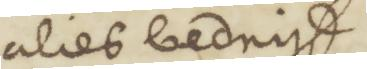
alies bedrijf
